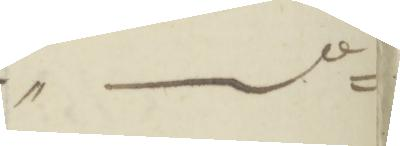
„ _=o
